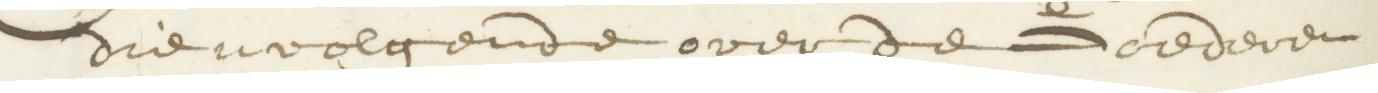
dienvolgende over de Goederen
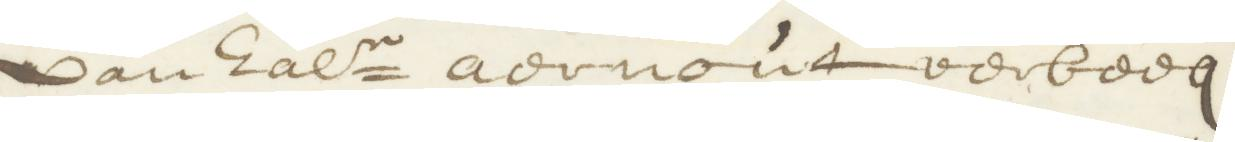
van zal=r aernout verbeeq
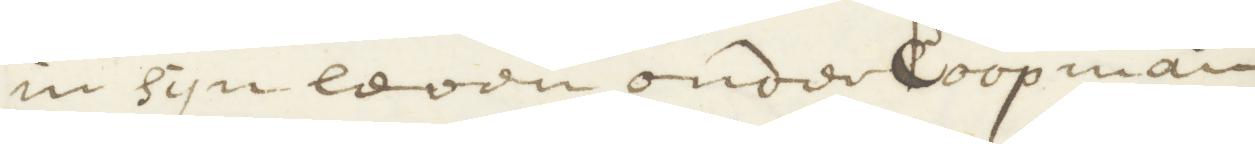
in sijn leven onderCoopman
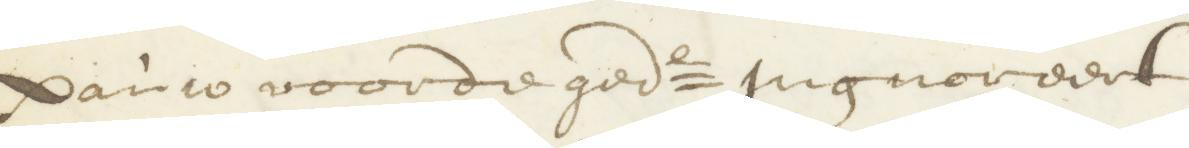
pauw voorde ged=e jngnoreert
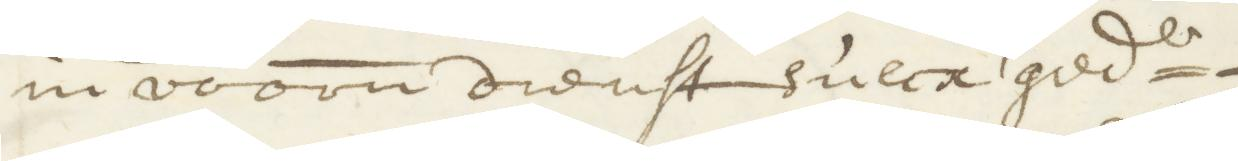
in voorn dienst sulcx ged=e —
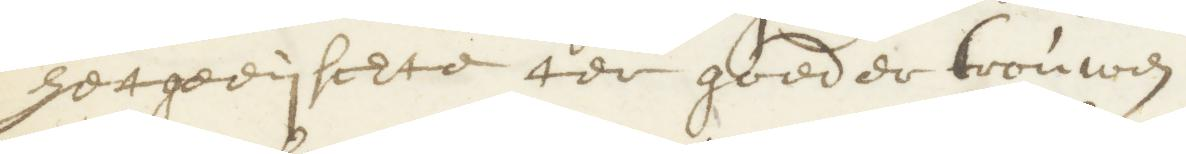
hetgeeijschte ter goeder trouwen
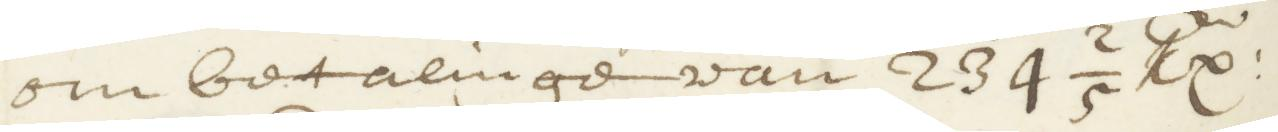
om betalinge van 234 2/5 Rx:
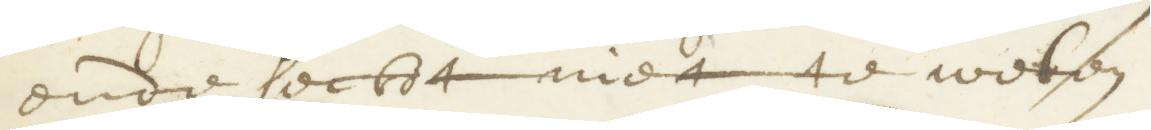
ende secht niet te weten
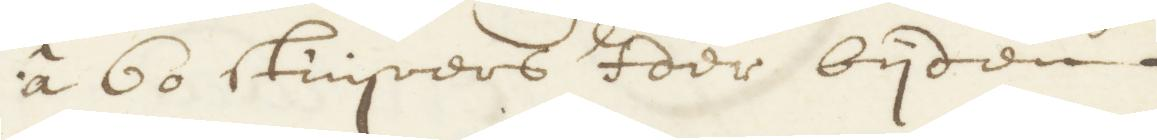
â 60 stuijvers Ider bijden —
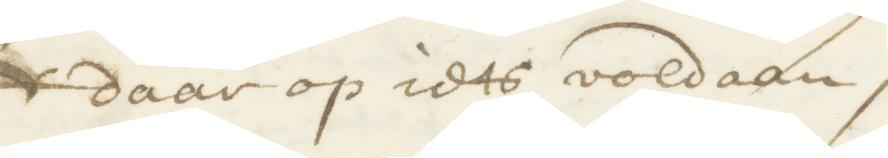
offdaar op iets voldaan,
